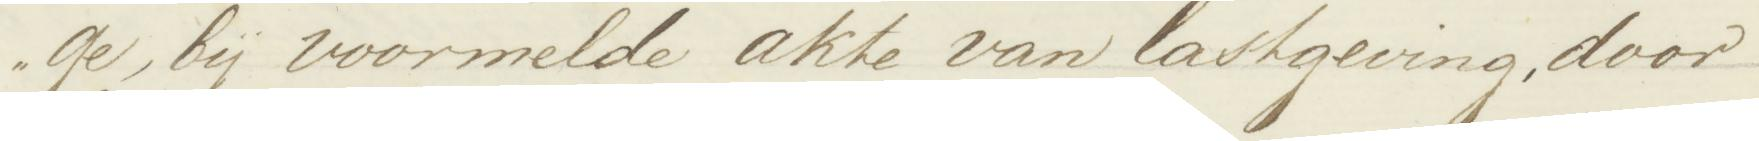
„ge, bij voormelde akte van lastgeving, door
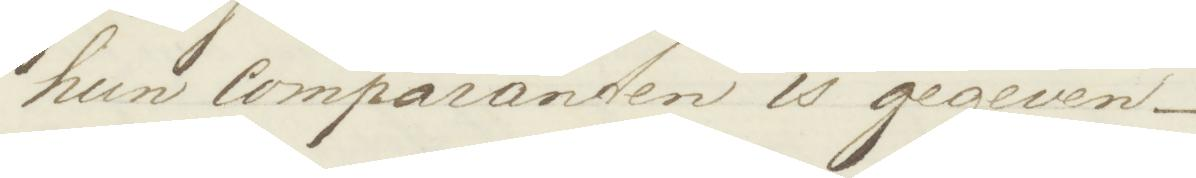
hun comparanten is gegeven —
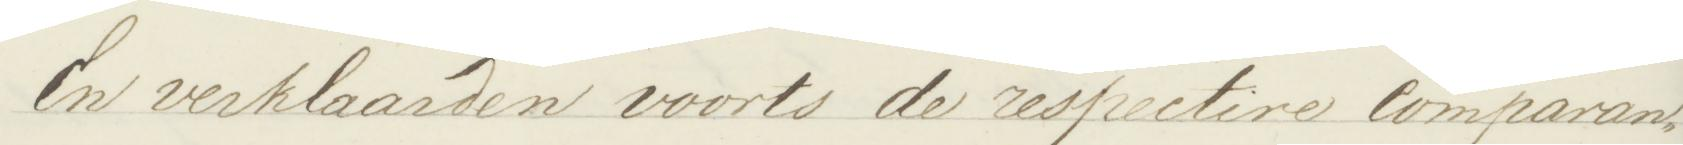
En verklaarden voorts de respective Comparan„
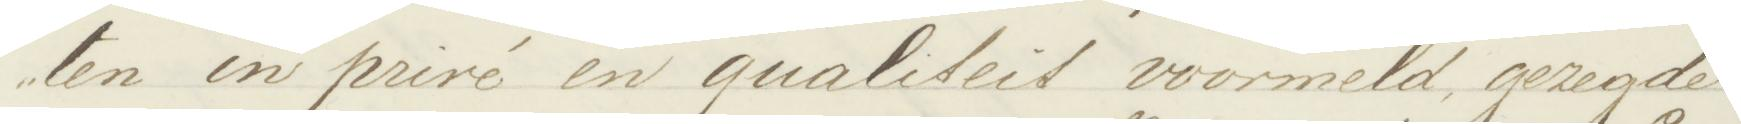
„ten in privé en qualiteit voormeld, gezegde
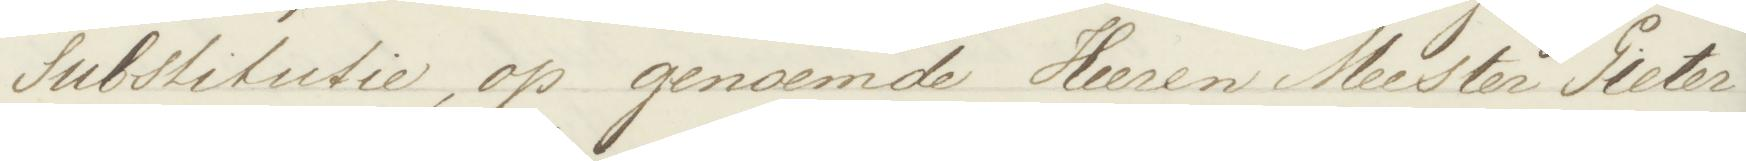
substitutie, op genoemde Heeren Meester Pieter
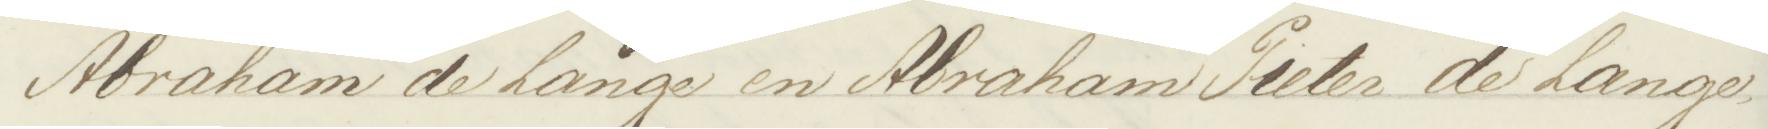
Abraham de Lange en Abraham Pieter de Lange,
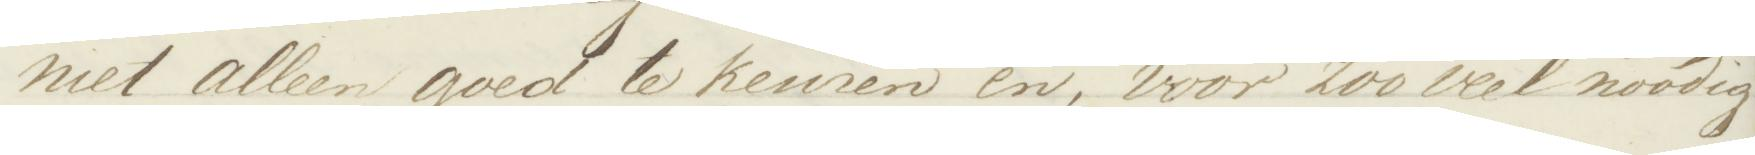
niet alleen goed te keuren en, voor zoo veel noodig
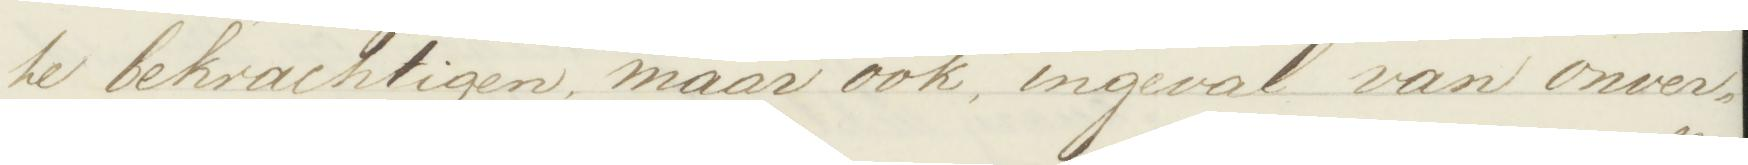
te bekrachtigen, maar ook, ingeval van onver„
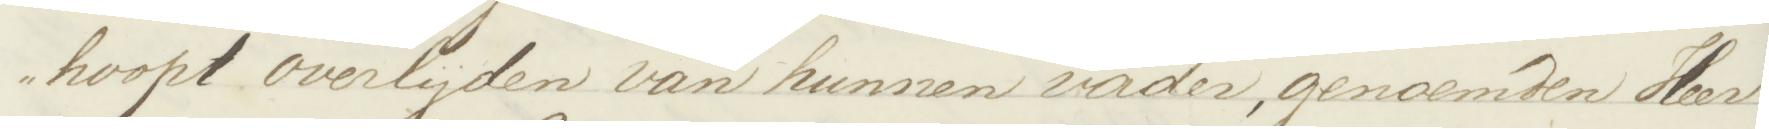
„hoopt overlijden van hunnen vader, genoemden Heer
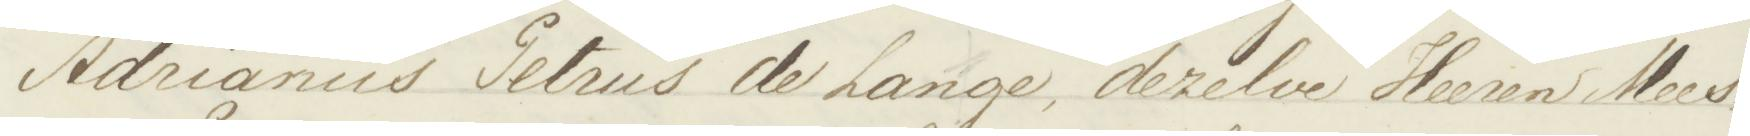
Adrianus Petrus de Lange, dezelve Heeren Mees
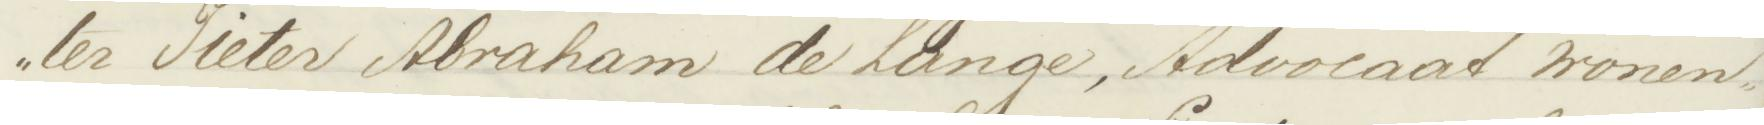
„ter Pieter Abraham de Lange, Advocaat wonen„
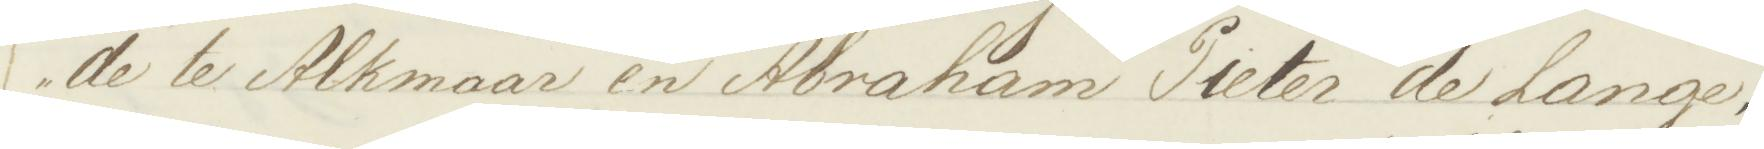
„de te Alkmaar en Abraham Pieter de Lange,
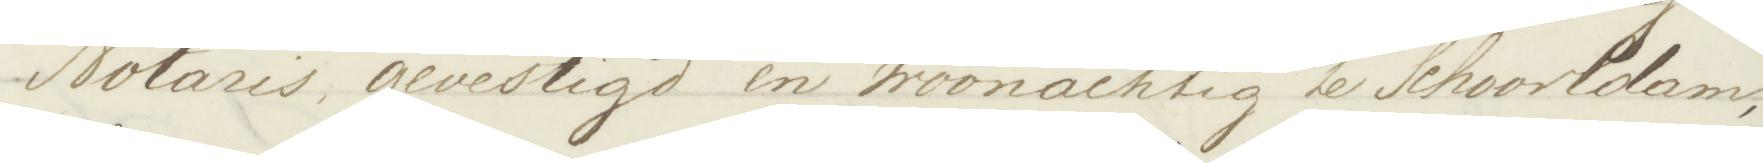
Notaris, gevestigd en woonachtig te schoorldam,
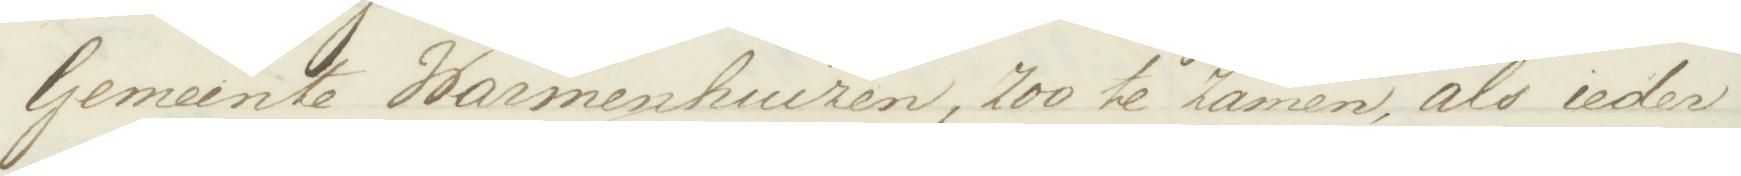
Gemeente Warmenhuizen, zoo te zamen, als ieder
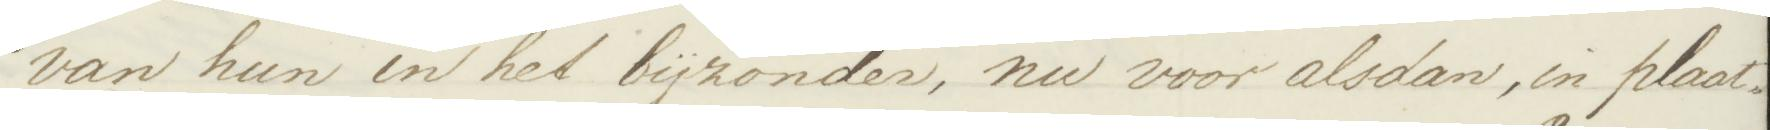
van hun in het bijzonder, nu voor alsdan, in plaat„
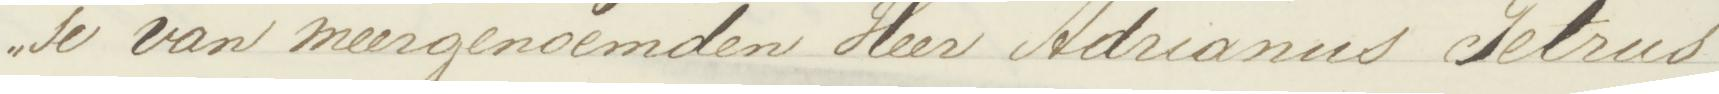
„se van meergenoemden Heer Adrianus Petrus
